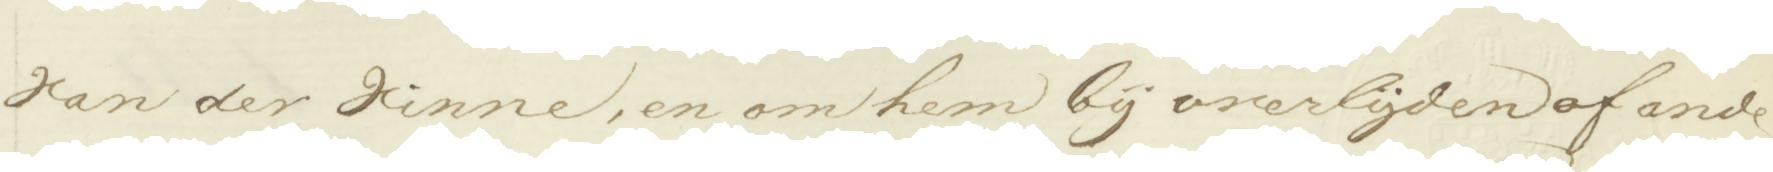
Van der Vinne, en om hem bij overlijden of ande
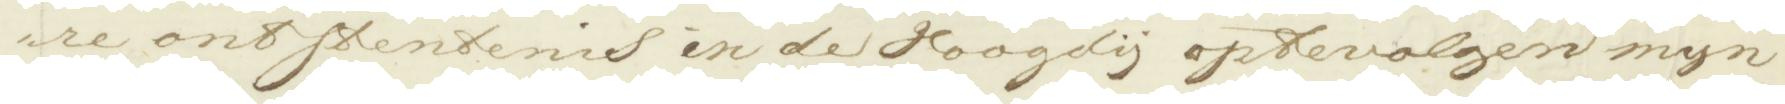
re ontstentenis in de Voogdij optevolgen mijn
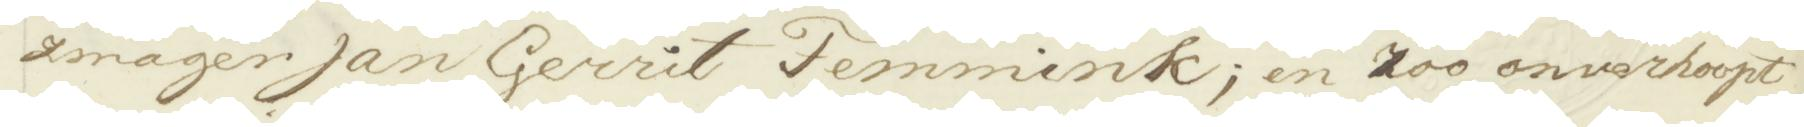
zwager Jan Gerrit Temmink; en zoo onverhoopt
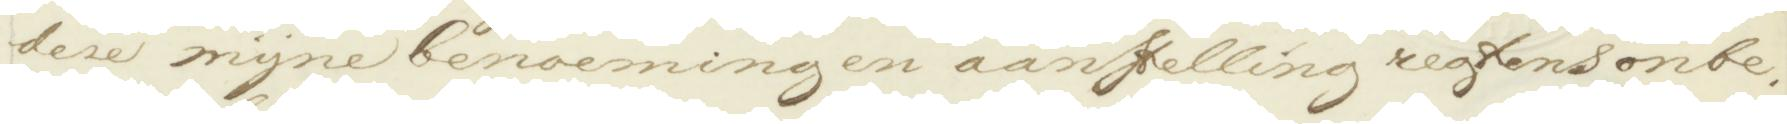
deze mijne benoeming en aanstelling regtens onbe,
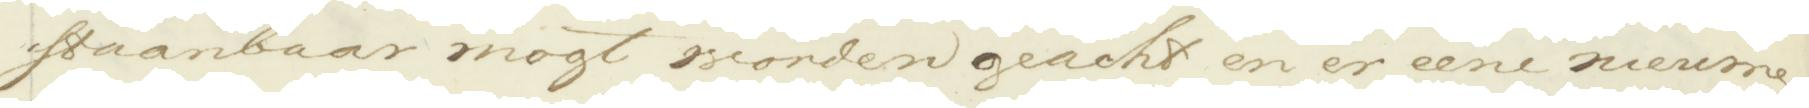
staanbaar mogt worden geacht en er eene nieuwe
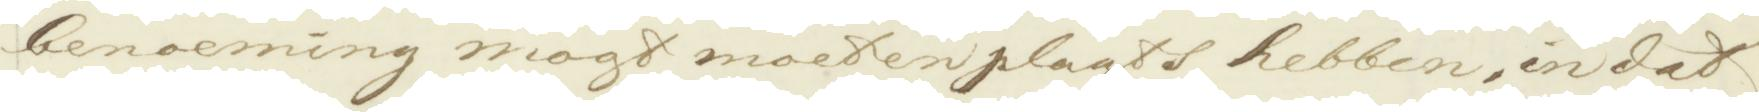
benoeming mogt moeten plaats hebben, in dat
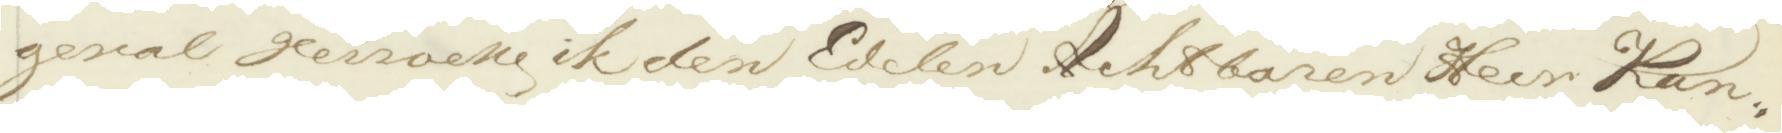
geval verzoeke ik den Edelen Achtbaren Heer Kan„
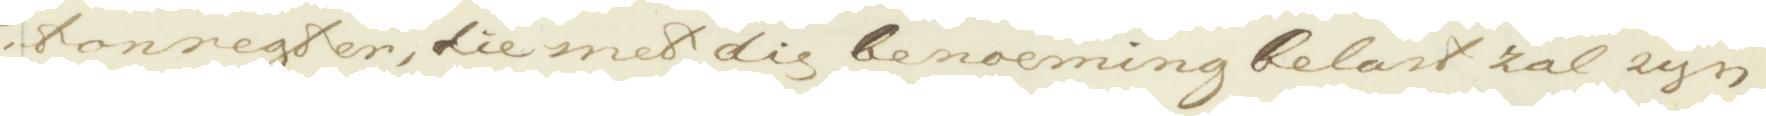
„tonregter, die met die benoeming belast zal zyn
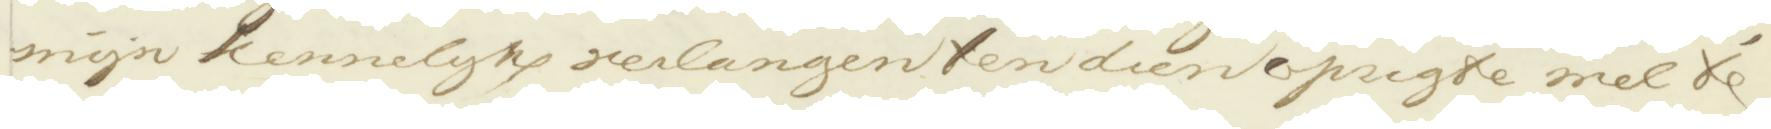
mijn kennelyk verlangen ten dien opzigte wel te
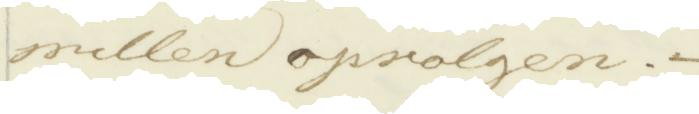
willen opvolgen.-
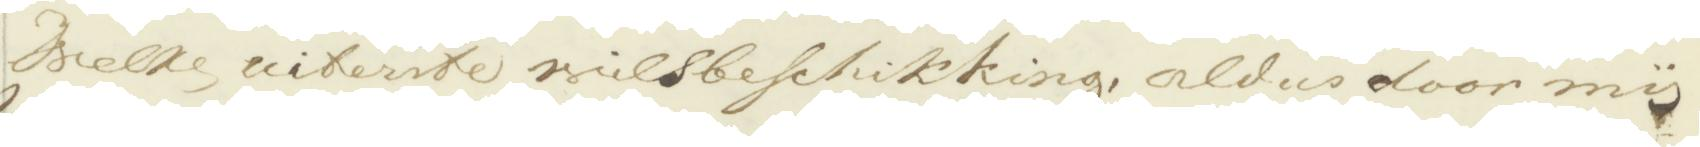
Welke uiterste wilsbeschikking, aldus door mij
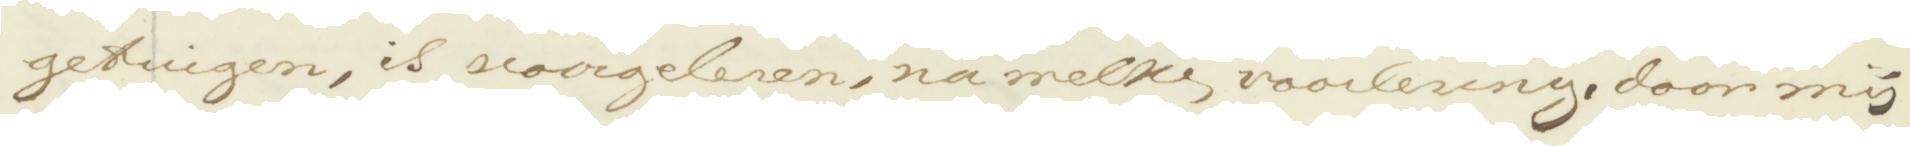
getuigen, is voorgelezen, na welke voorlezing, door mij
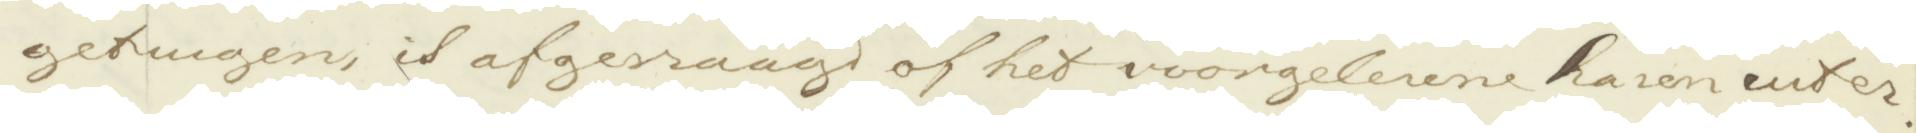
getuigen, is afgevraagd of het voorgelezene haren uiter
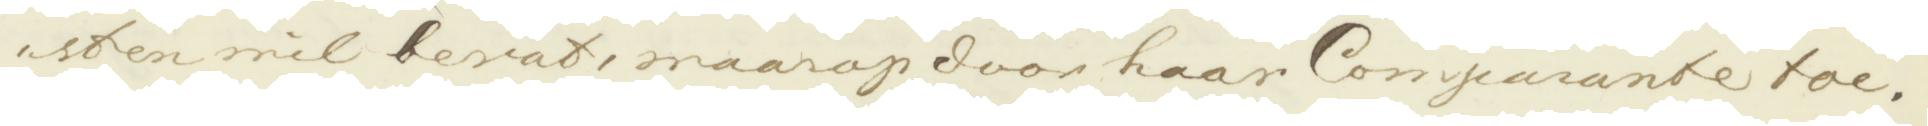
sten wil bevat, waarop door haar Comparante toe„
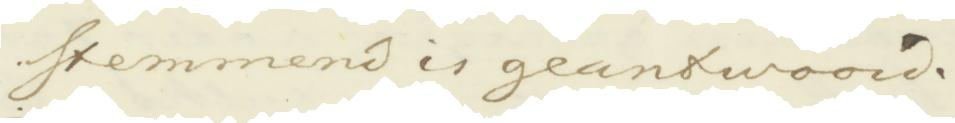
„stemmend is geantwoord.
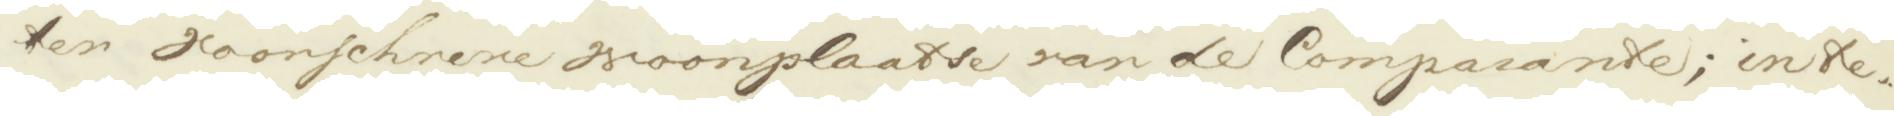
ten voorschreve woonplaatse van de Comparante; in te
